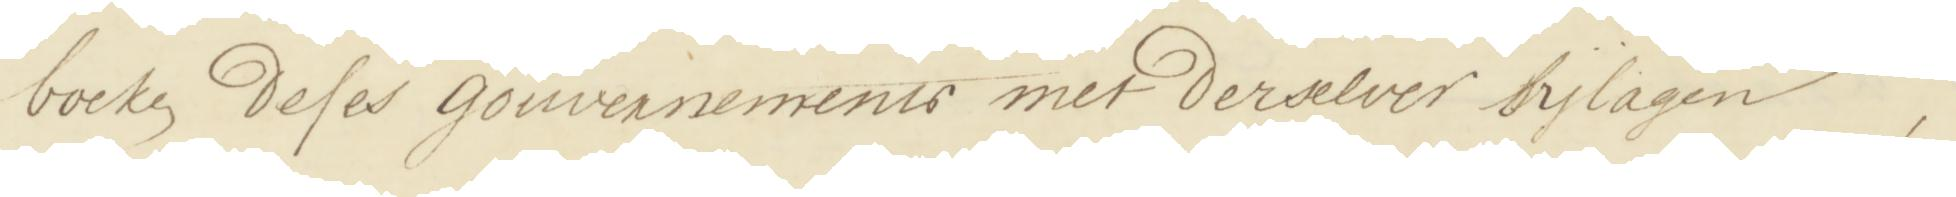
boeken deses gouvernements met derselver bijlagen,
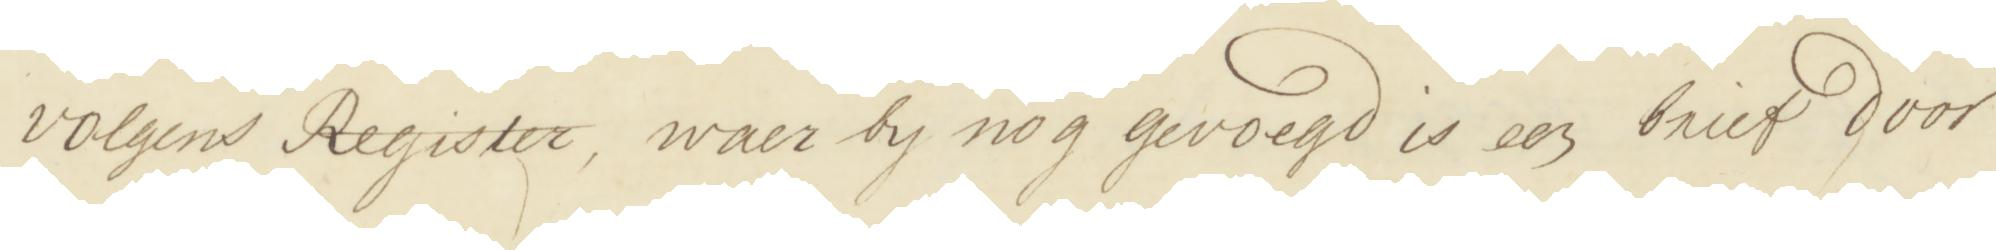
volgens Register, waer by nog gevoegd is een brief door
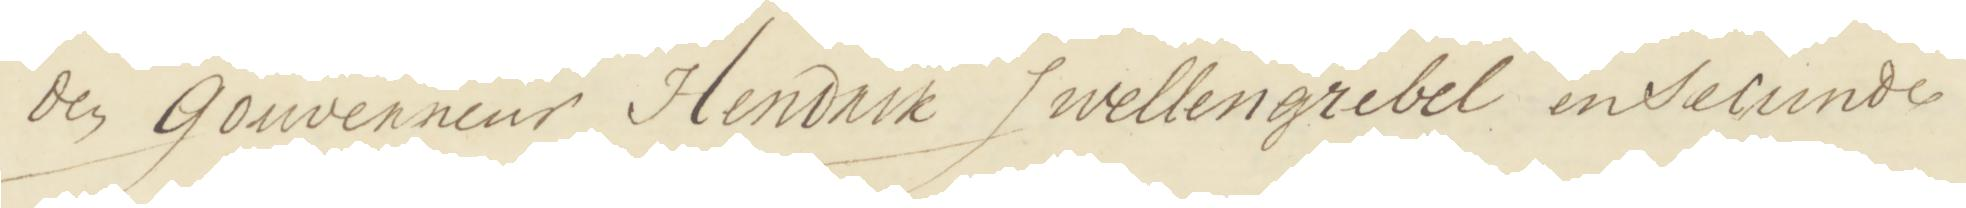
den Gouverneur Hendrik Swellengrebel en secunde
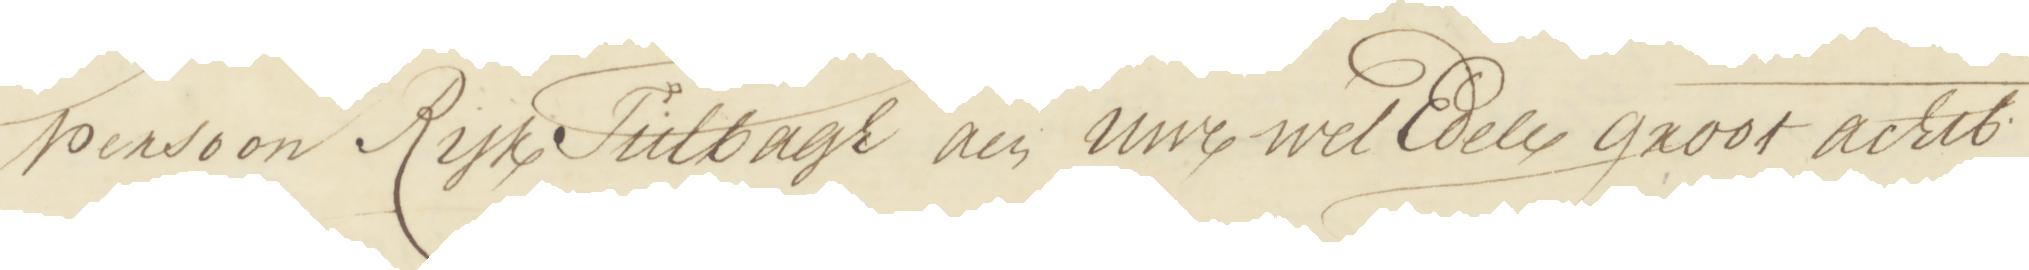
persoon Ryk Tulbagh aen uwe wel Edele groot achtb:
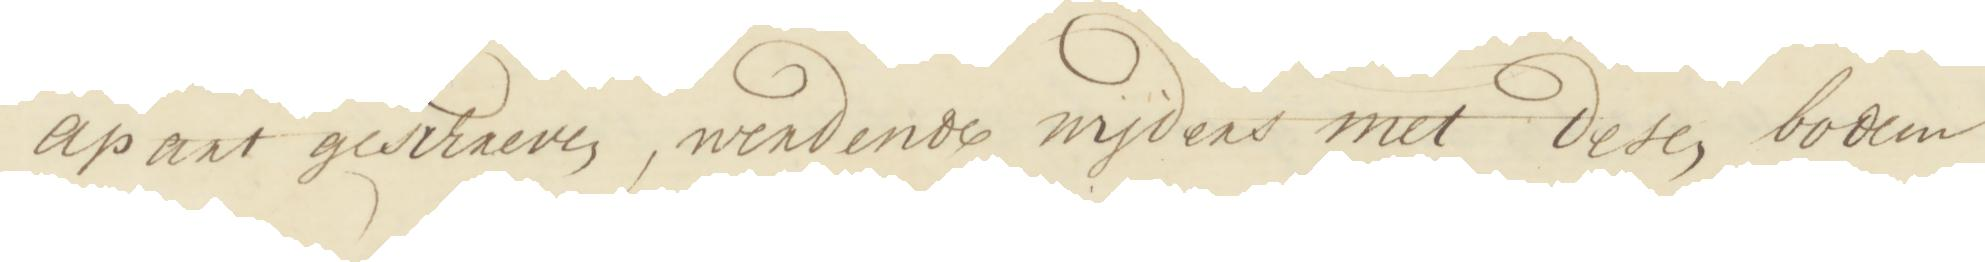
apart geschreven, werdende wijders met desen bodem
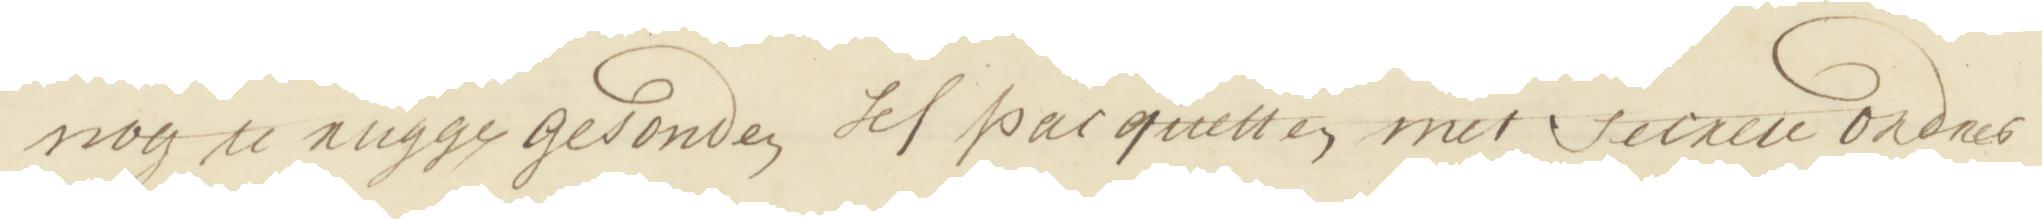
nog te rugge gesonden ses pacquetten met secrete ordres
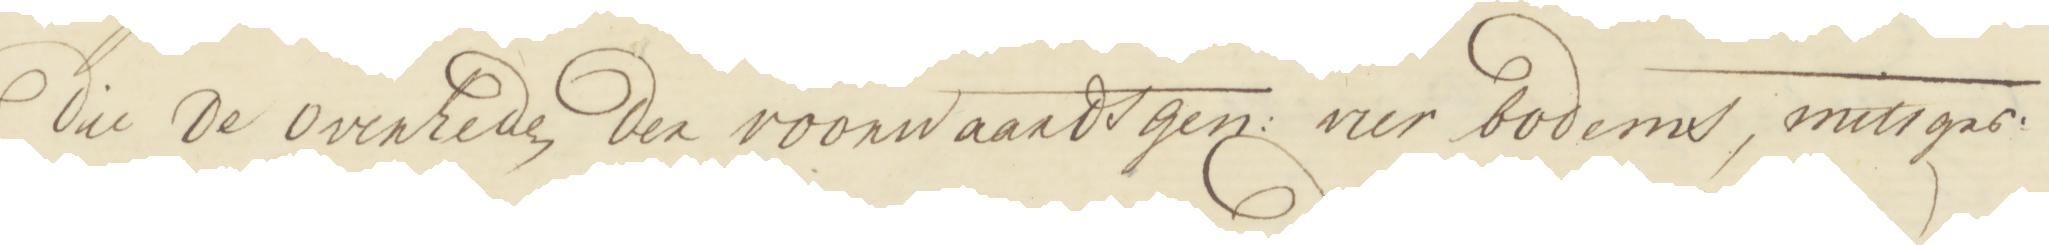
die de overheden der voorwaards gem: vier bodems, mitsgrs:
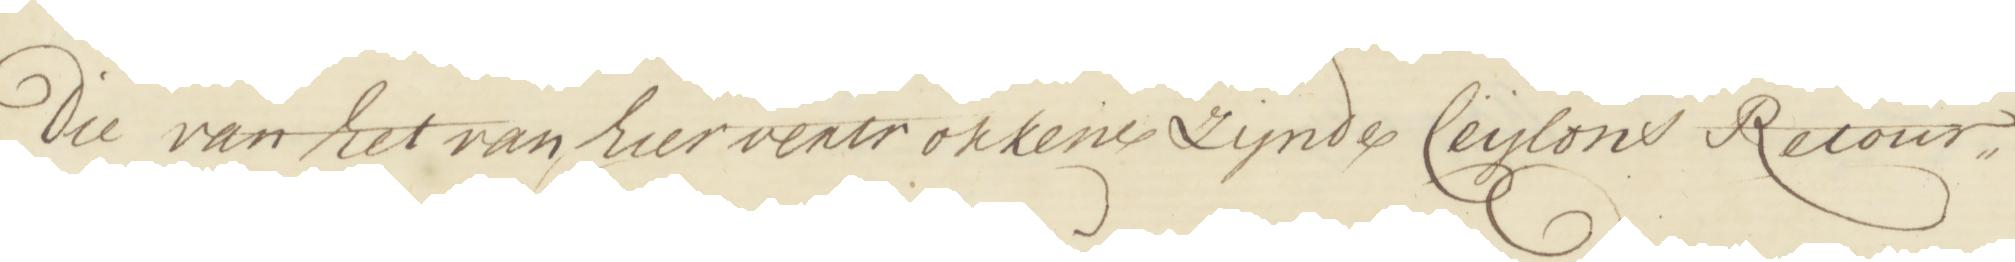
die van het van hier vertrokkene zijnde Ceijlons Retour„
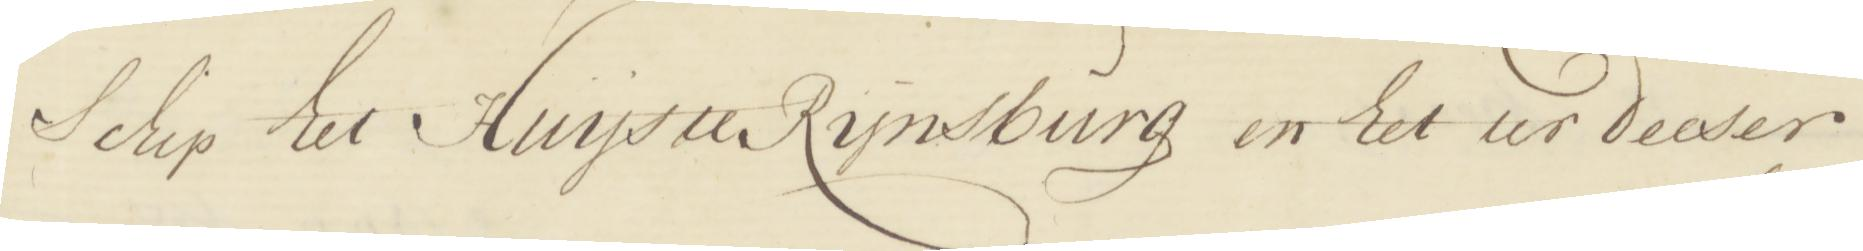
schip het Huijs te Rijnsburg en het ter deeser
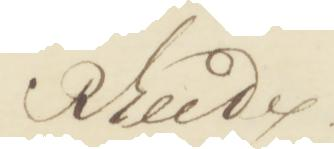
Rheede
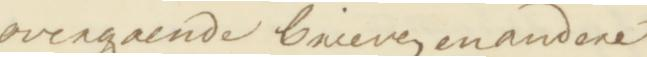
overgaende brieven en andere
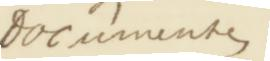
documenten
